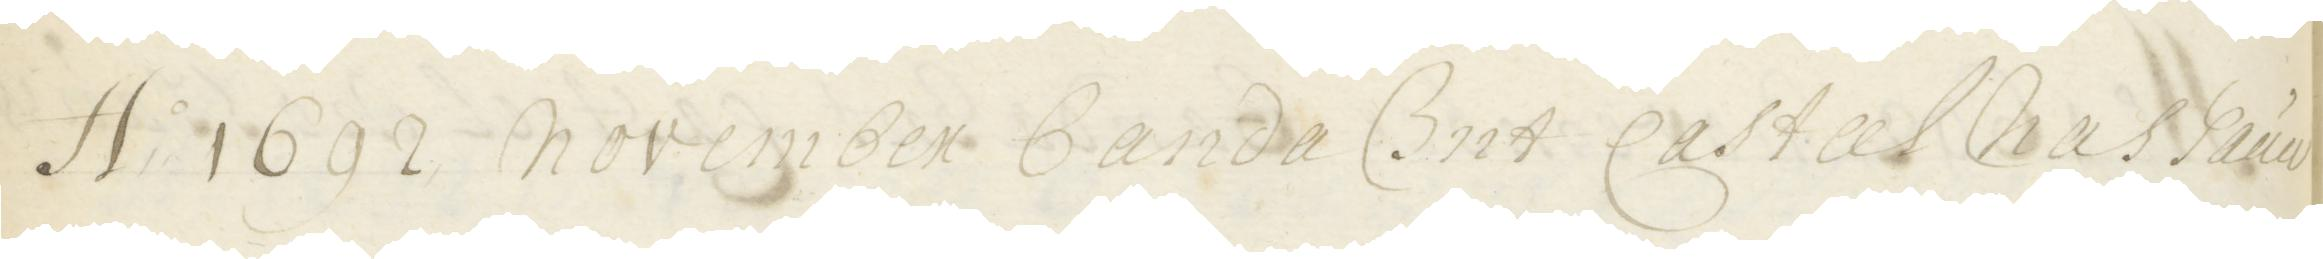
A„o 1692 november banda Int: Casteel nassauw
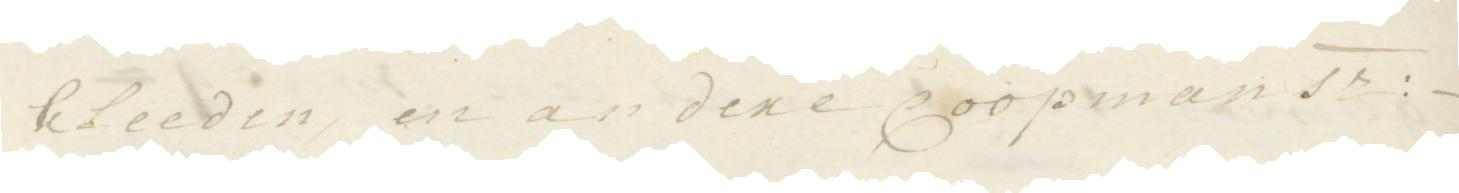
kleeden, en andere Coopmansz:-
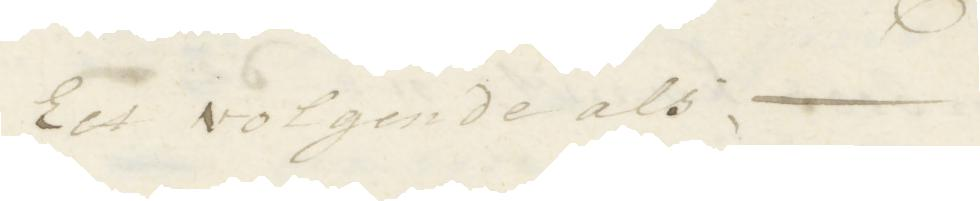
het volgende als; —
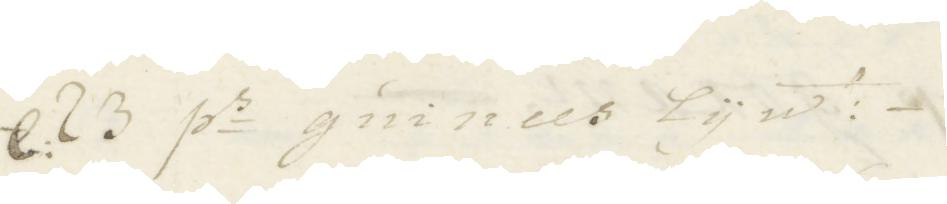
l: 23 p=s guinees lijw:t —
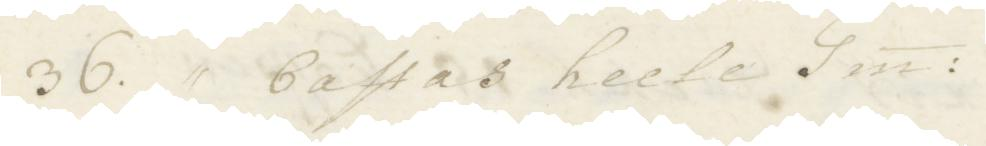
36. „ baftas heele sm:
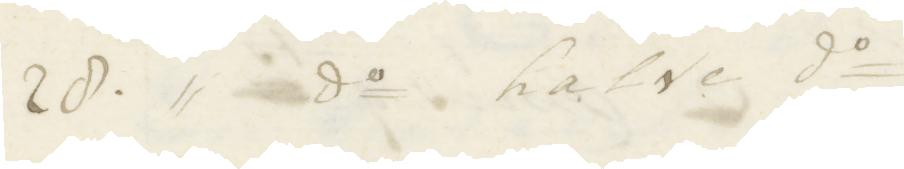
28. „ d=o halve d=o
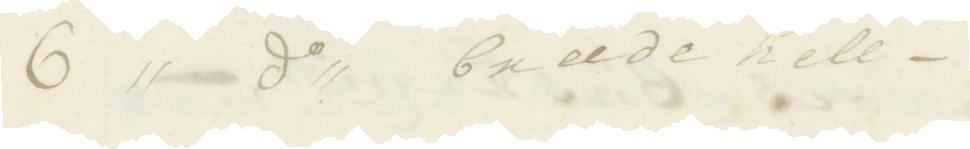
6 „ d„o breede hele —
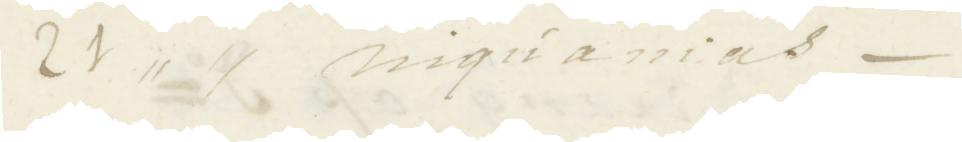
21 „ „ niquanias —
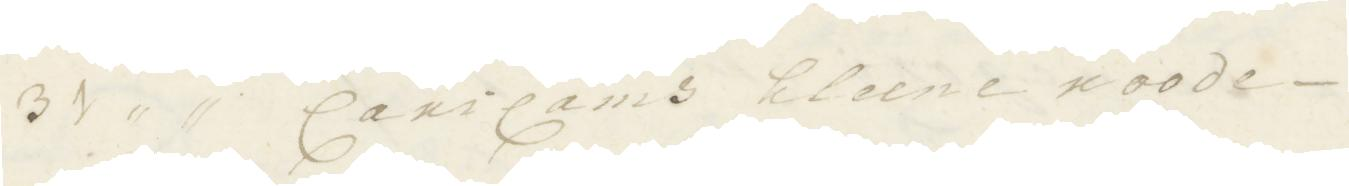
31 „ „ caricams kleene roode —
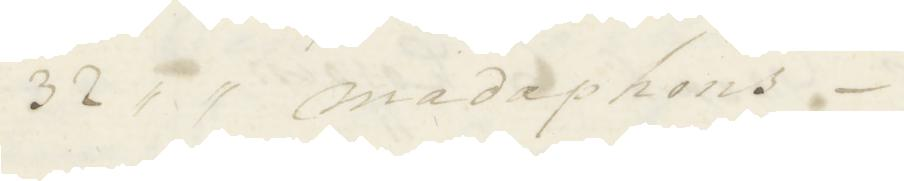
32 „ „ madaphons —
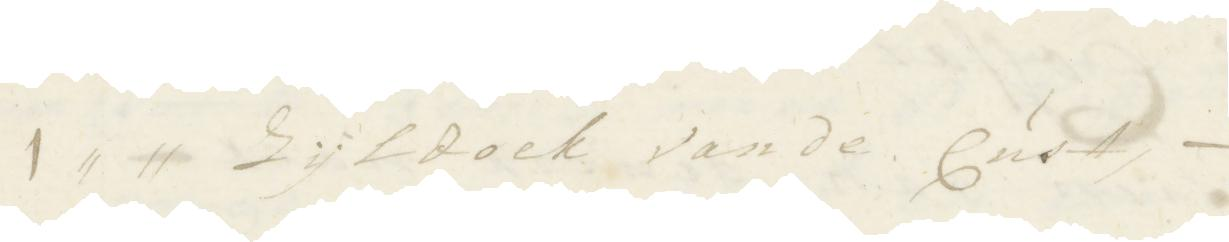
1 „ „ zijldoek van de cust —
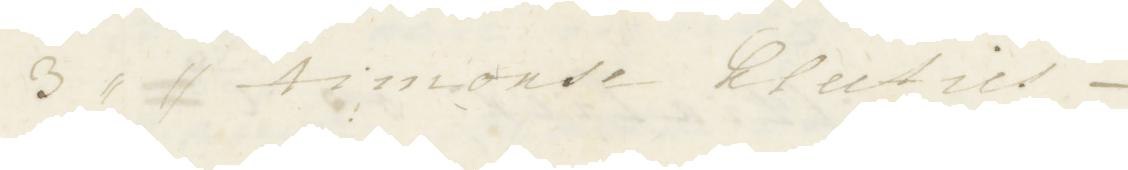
3 „ „ timorse kleeties —
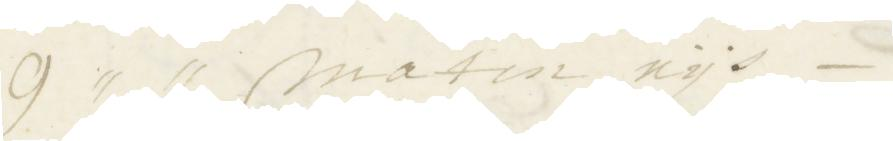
9 „ „ maten rijs —
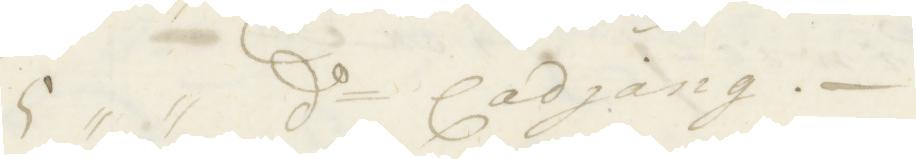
5 „ „ d=o cadjang. —
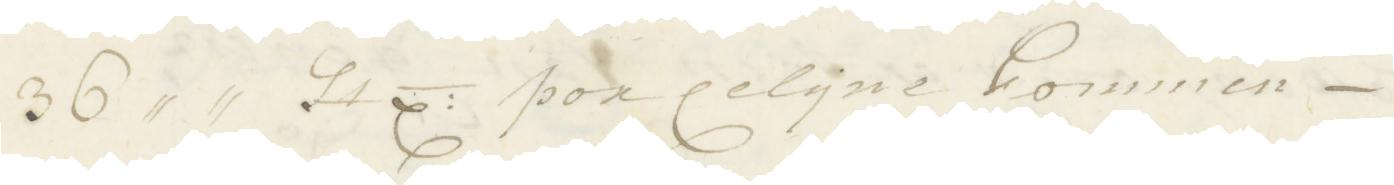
36 „ „ stx: porcelijne kommen —
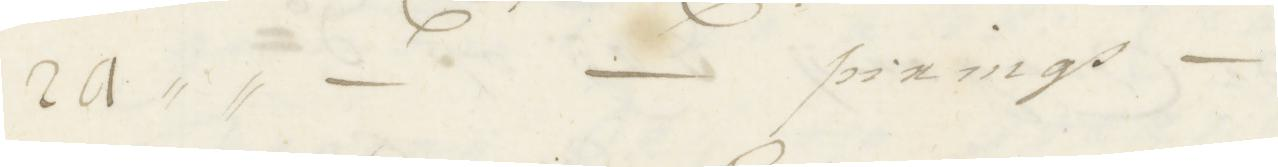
24 „ „ — — pirings —
